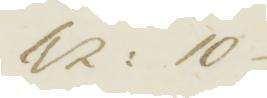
42: 10 —
